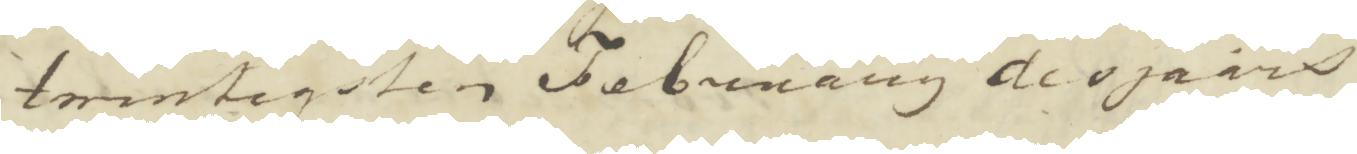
twintigsten February des jaars
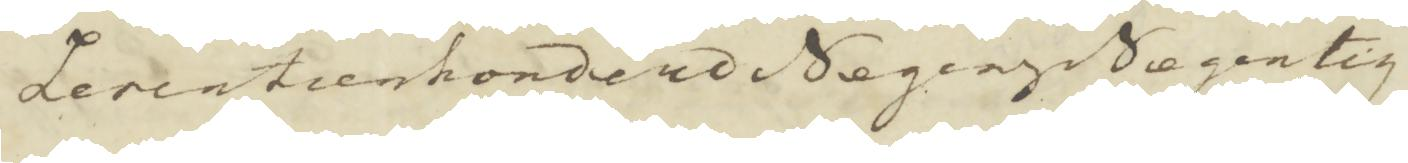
Zeventienhonderd Negenen Negentig
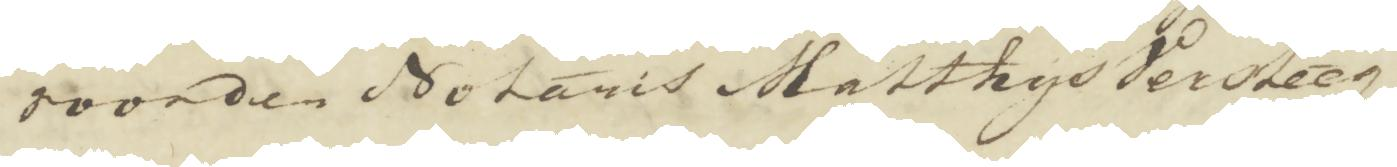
voorden Notaris Matthys Versteeg
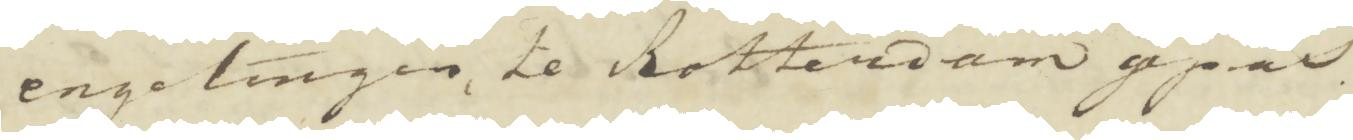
en getuigen, te Rotterdam gepas
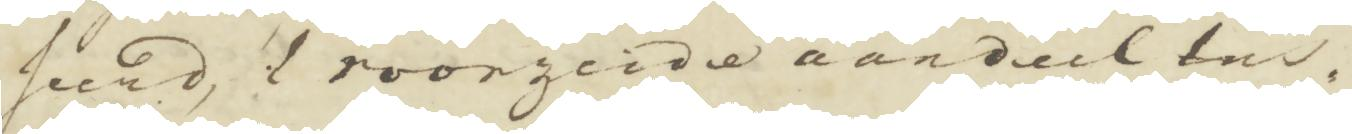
seerd, 't voorzeide aandeel tus„
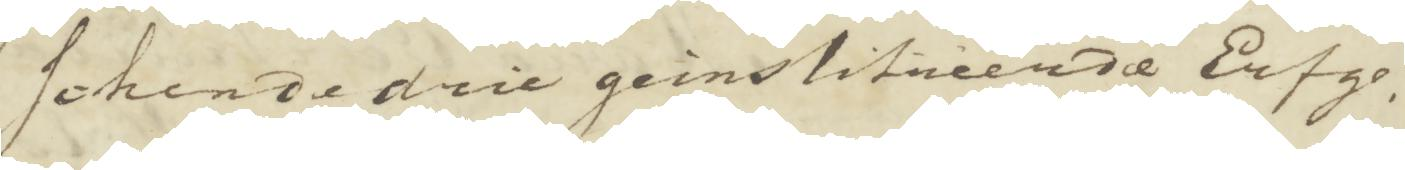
schende drie geinstitueerde Erfge„
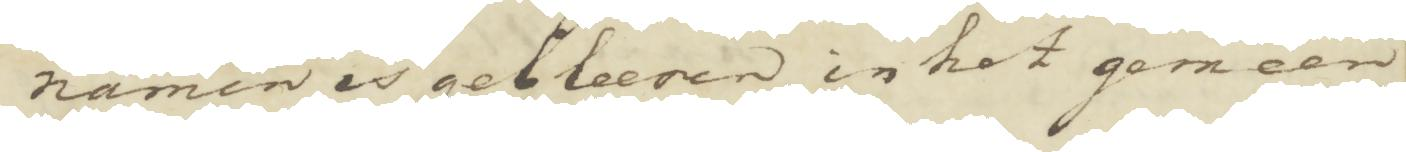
namen is gebleeven in het gemeen
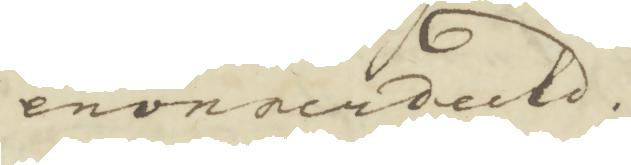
en onverdeeld.
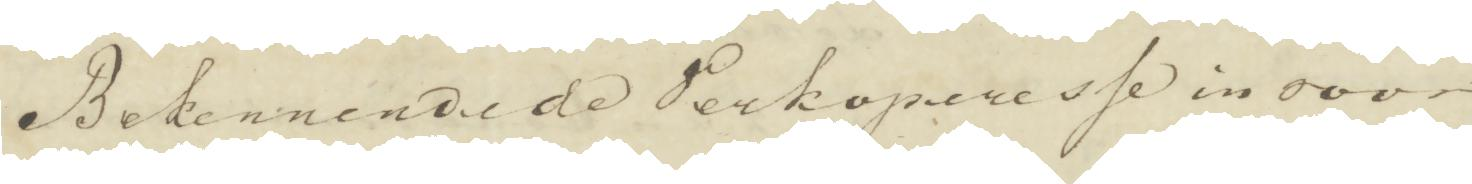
Bekennende de Verkoperesse in voor
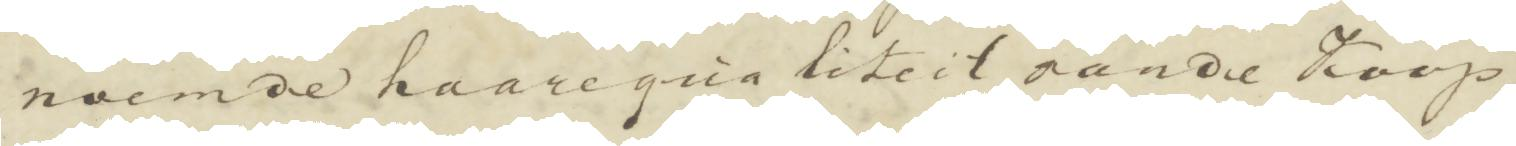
noemde haare qualiteit van de Koop
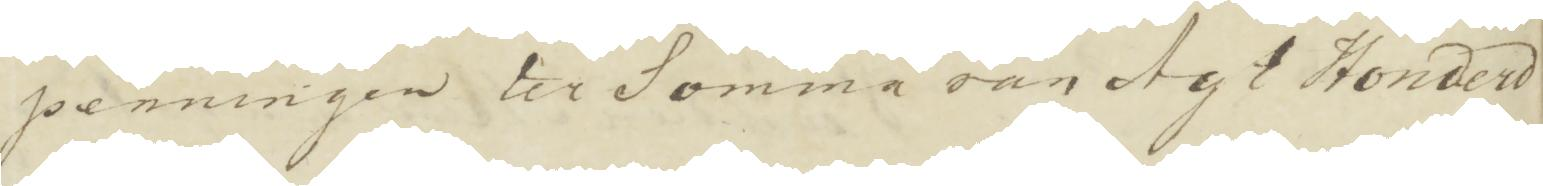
penningen ter somma van Agt Honderd
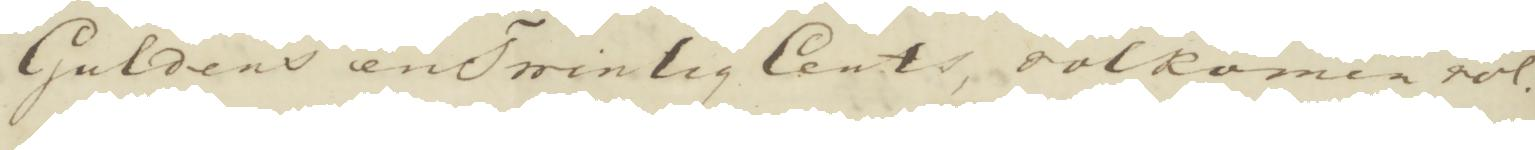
Guldens en Twintig Cents, volkomen vol„
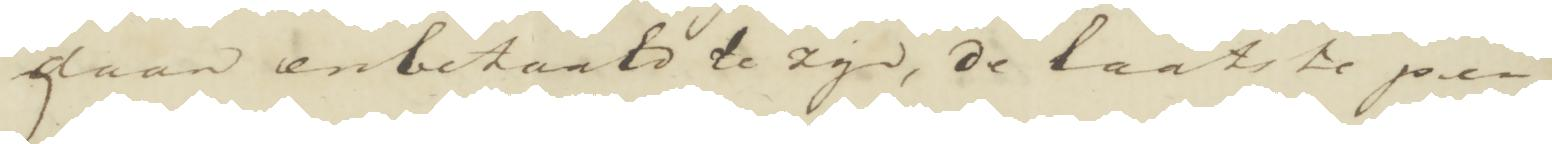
daan en betaald te zijn, de laatste pen
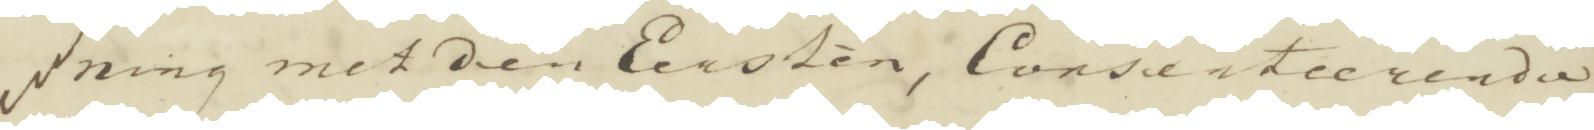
ning met den Eersten, Consenteerende
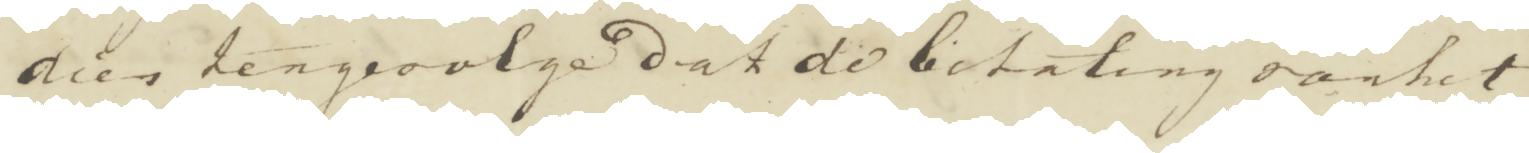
dien ten gevolge dat de betaling van het
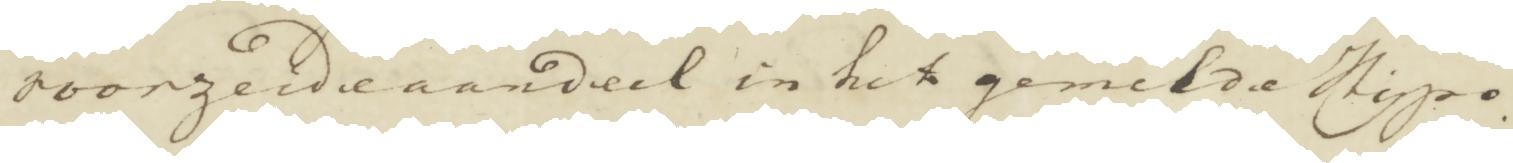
voorzeide aandeel in het gemelde Hypo
